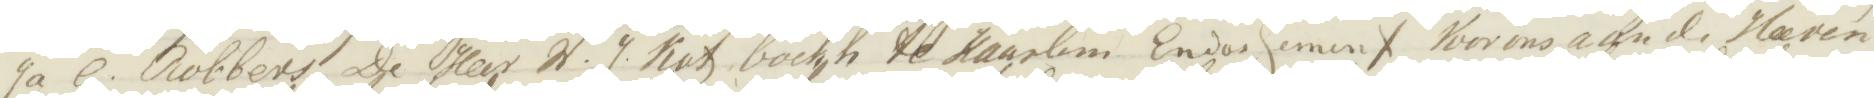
Ja G. Robbers De Heer W. J. Kat boekh te Haarlem Endossement Voor ons aan de Heeren
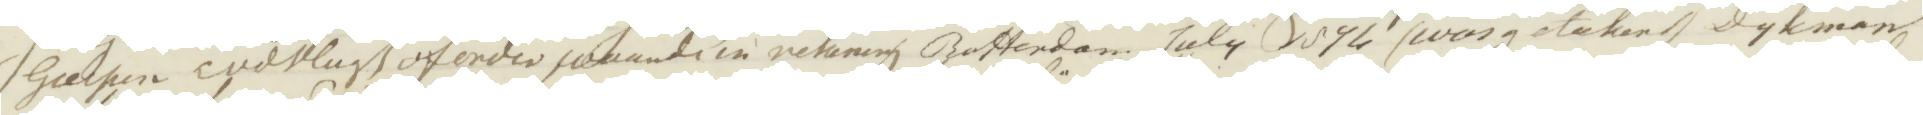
Guepin & vd Vlugt of order waarde in rekening Rotterdam July 1874 (was getekend) Dykman
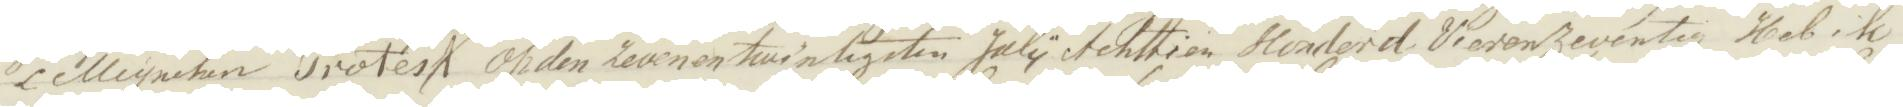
& Meijneken Protest Op den zeven en twintigsten Julij Achttien Honderd Vierenzeventig Heb ik
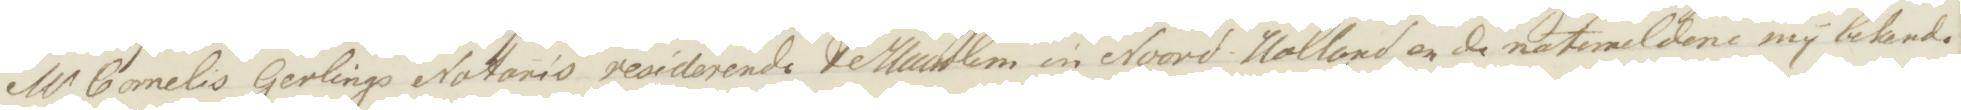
Mr Cornelis Gerlings Notaris residerende te Haarlem in Noord-Holland en de natemeldene mij bekende
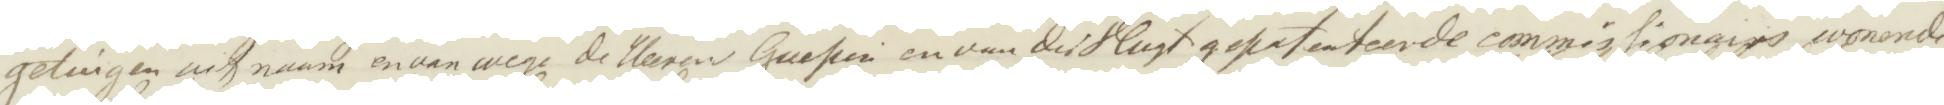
getuigen uit naam en van wege de Heeren Guepin en van der Vlugt gepatenteerde commissionairs wonende
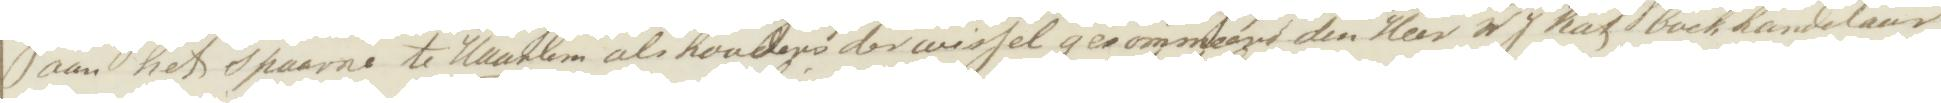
aan het spaarne te Haarlem als houders der wissel gesommeerd den Heer W J Kat boekhandelaar
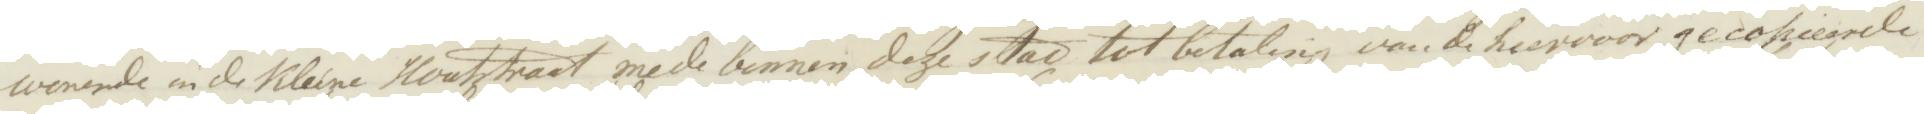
wonende in de Kleine Houtstraat mede binnen deze stad tot betaling van de hiervoor gecopieerde
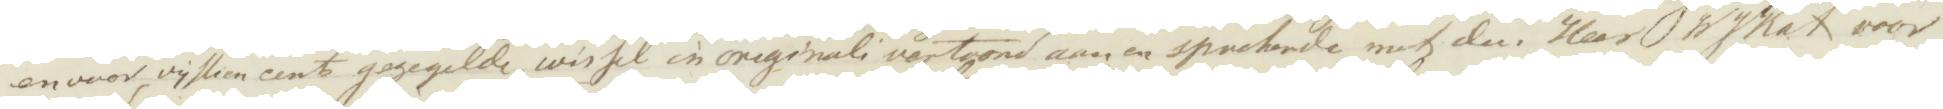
en voor vijftien cent gezegelde wissel in originali vertoond aan en sprekende met den Heer W J Kat voor
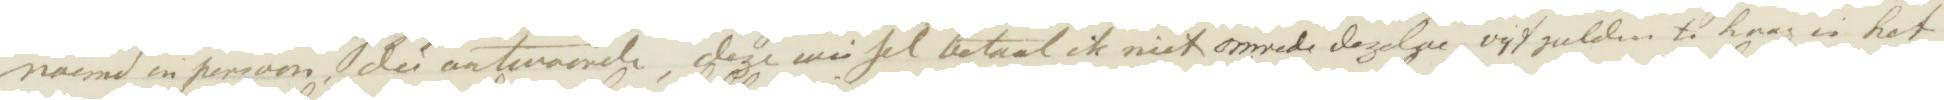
noemd in persoon, die antwoorde, deze wissel betaal ik niet omrede dezelve vijf gulden te hoog is het
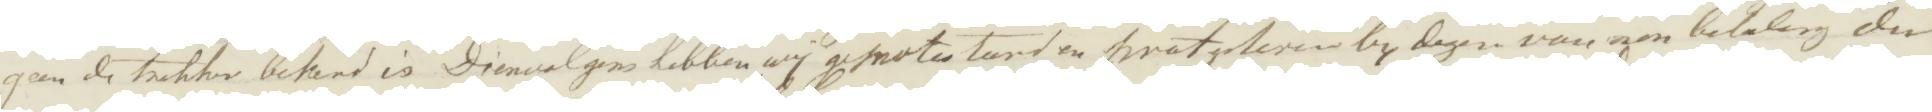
geen de trekker bekend is Dienvolgens hebben wij geprotesteerd en protesteren by dezen van non betaling der
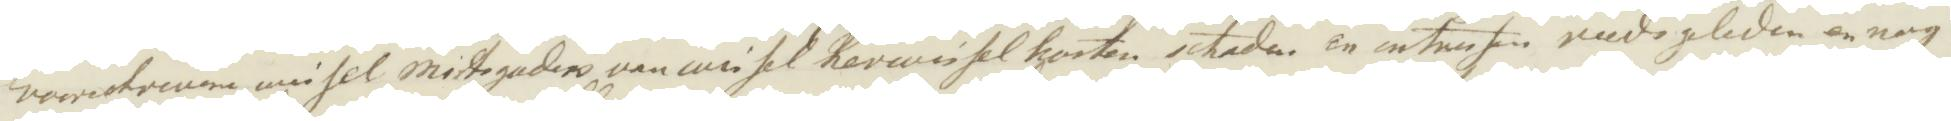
voorschrevene wissel mitsgaders van wissel herwissel kosten schaden en intressen reeds geleden en nog
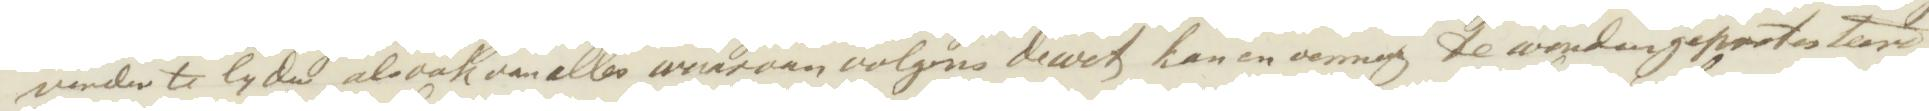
verder te lyden als ook van alles waarvan volgens de wet kan en vermag te worden geprotesteerd
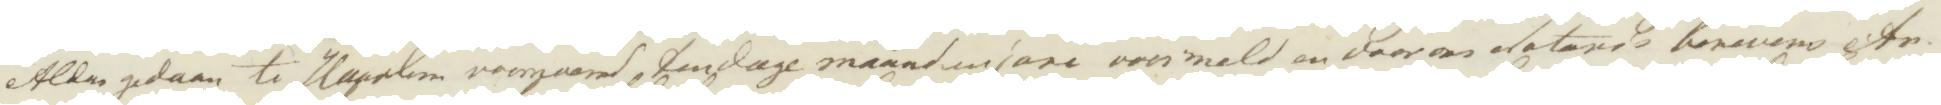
Aldus gedaan te Haarlem voornoemd ten dage maand en jare voormeld en door ons Notaris benevens Ar.
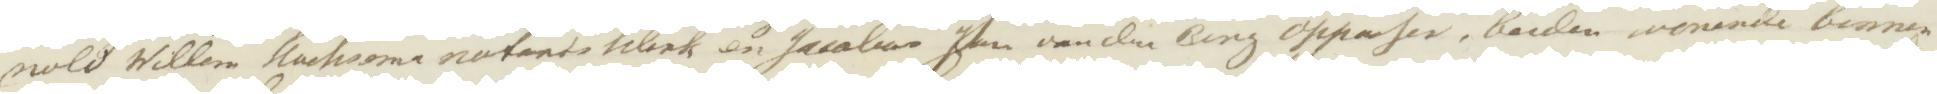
nold Willem Haeksema notaris klerk en Jacobus Jan van den Berg Oppasser, beiden wonende binnen
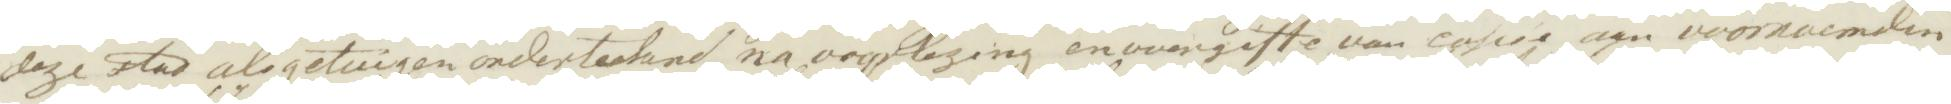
deze stad als getuigen onderteekend na voorlezing en overgifte van copie aan voornoemden
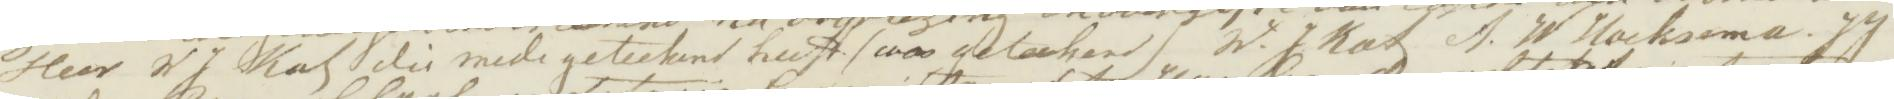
Heer W J Kat die mede geteekend heeft (was geteekend) W. J. Kat A. W Haeksema. JJ
